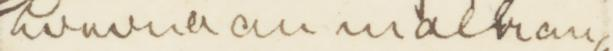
keren aan malkan„
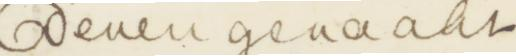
deren geraakt
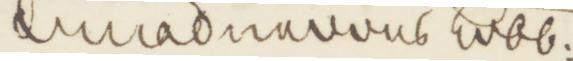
de madureers hebb:
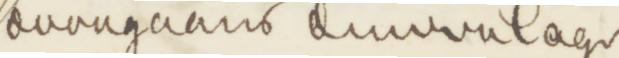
doorgaans demeerlage
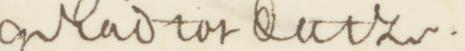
gehad tot dat ze.
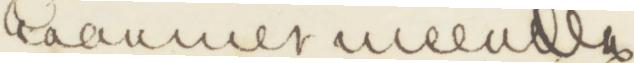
haar met meerder
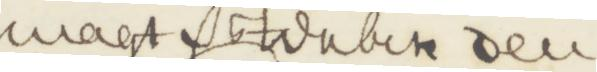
magt versterken den
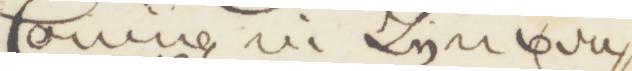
Coning in zijn ver„
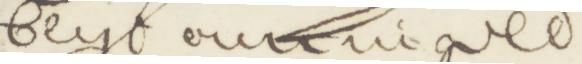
blijf onccne geld
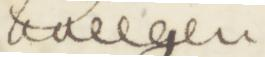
kreegen
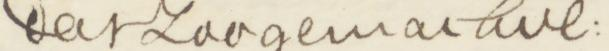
dat zoo gemackelijk
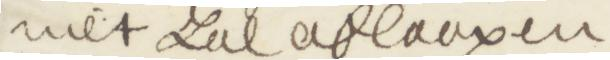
niet zal afloopen
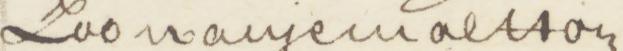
zoo wanjemaltton
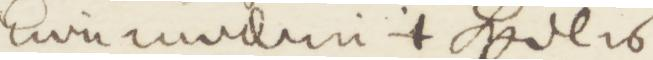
hier mede in ’t spel is
